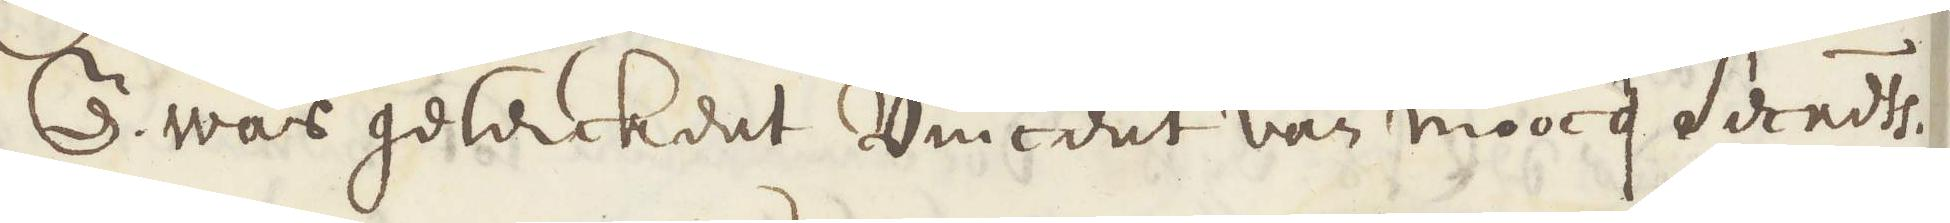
ende was geteeckent Vincent van moocq Secrets.
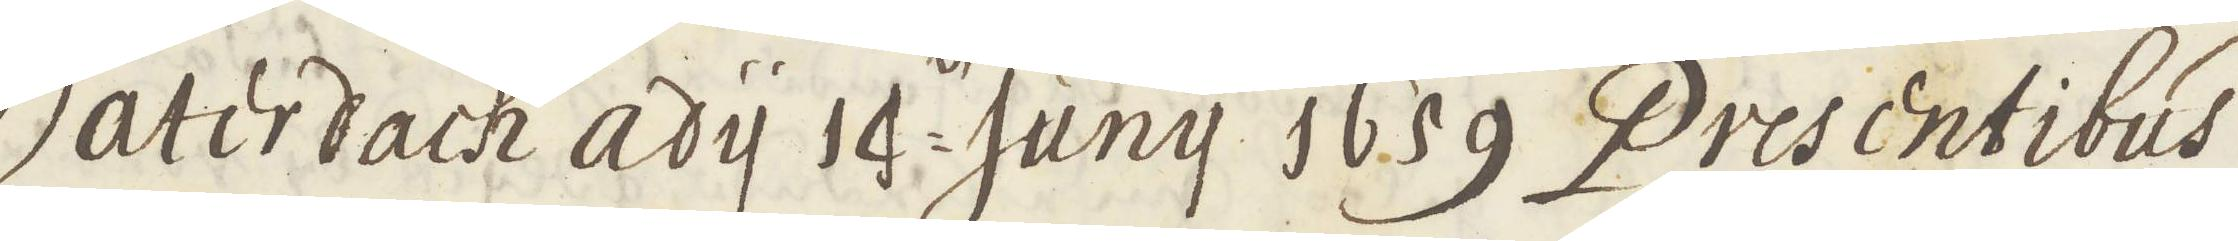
Saterdach adij 14:e Junij 16.=59 Presentibus
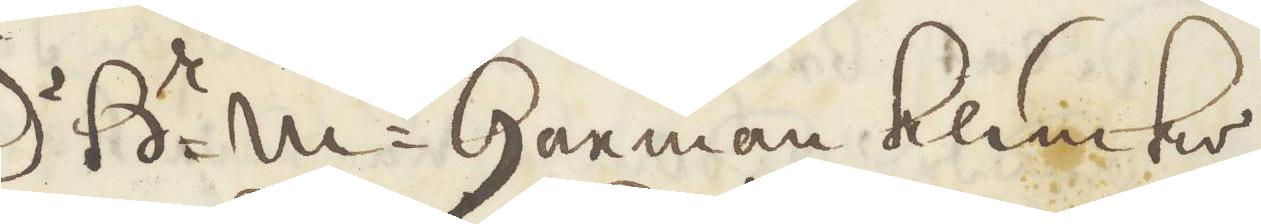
D' H=r M=r Harman klencke
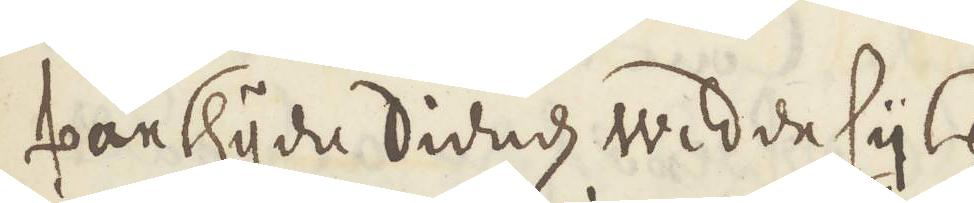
parthijen dienen wedersijts
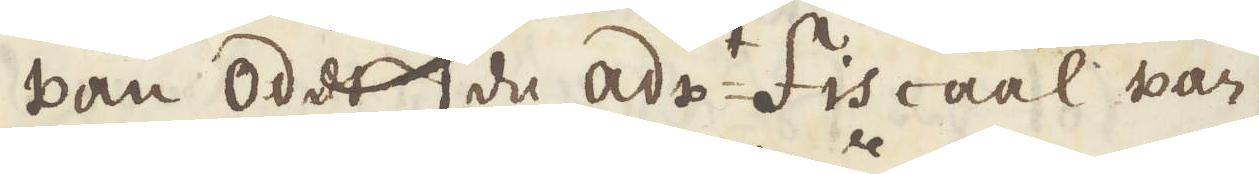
van Odessen adv=t fiscael van
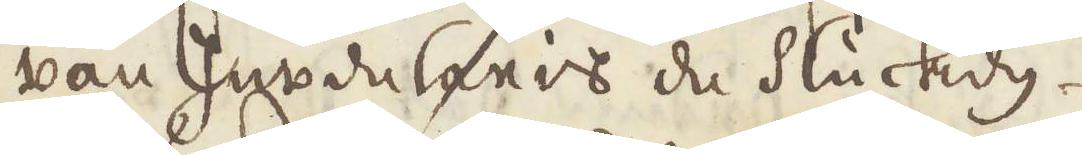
van Jnventaris en stucken
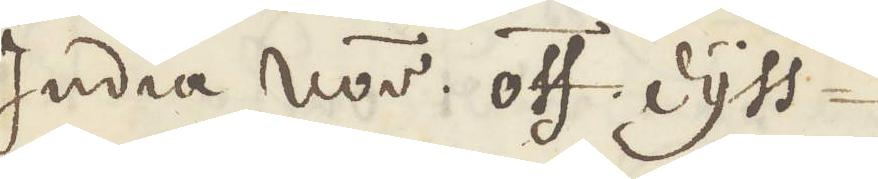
Jndia noe. off. Eijss=r
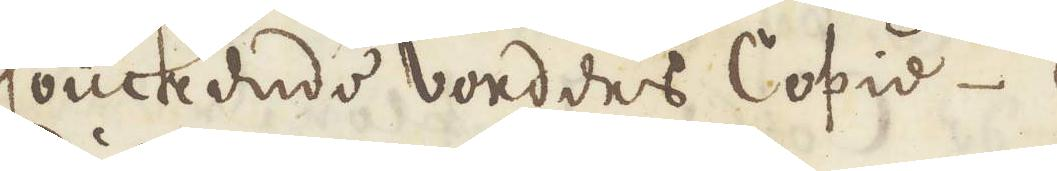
versouckende vorders Copie —
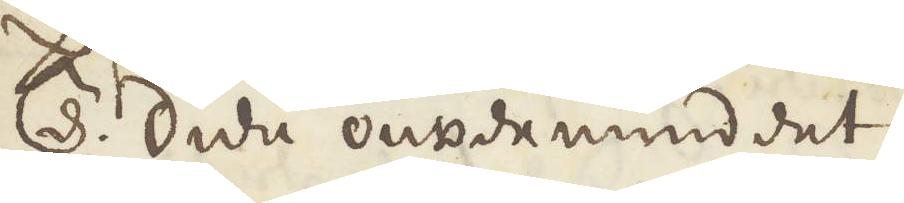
ende dien onvermindert
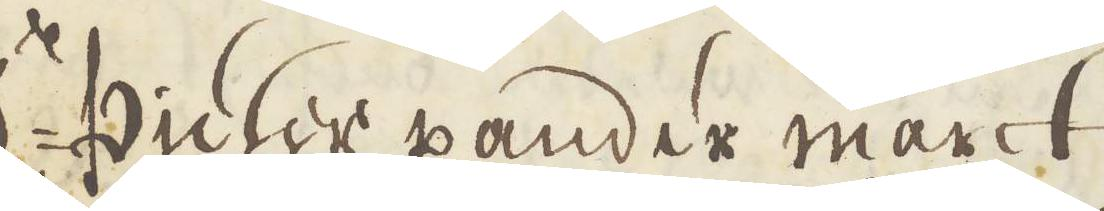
S=r Pieter vander marct
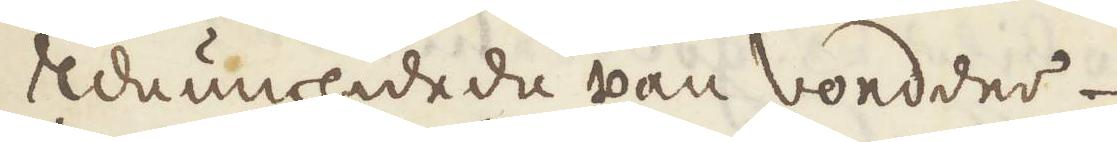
renunchieren van vordere -
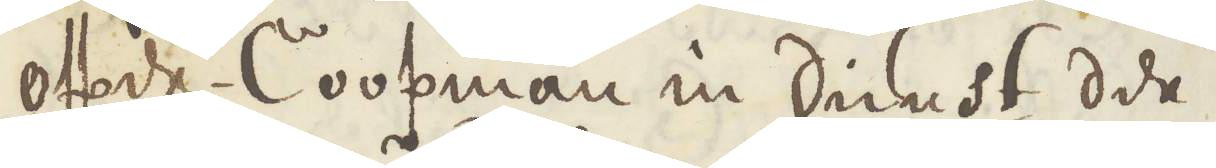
opper-Coopman in dienst der
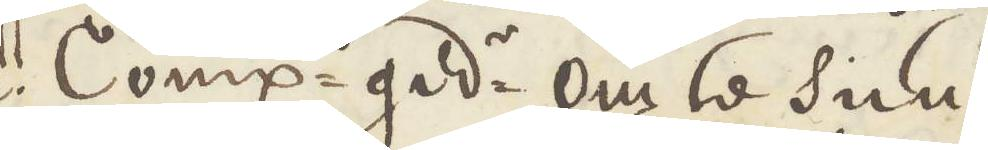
E. Comp=e ged=e om te sien
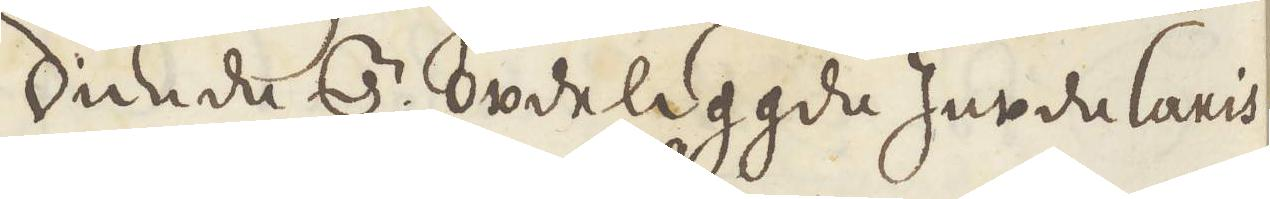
dienen ende overleggen Jnventaris
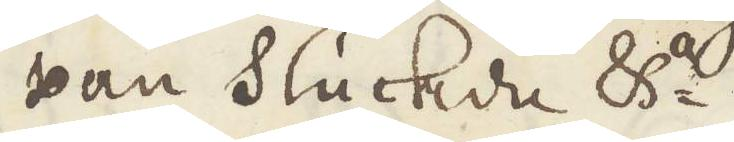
van stucken Et=a
